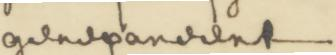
gerepareert
